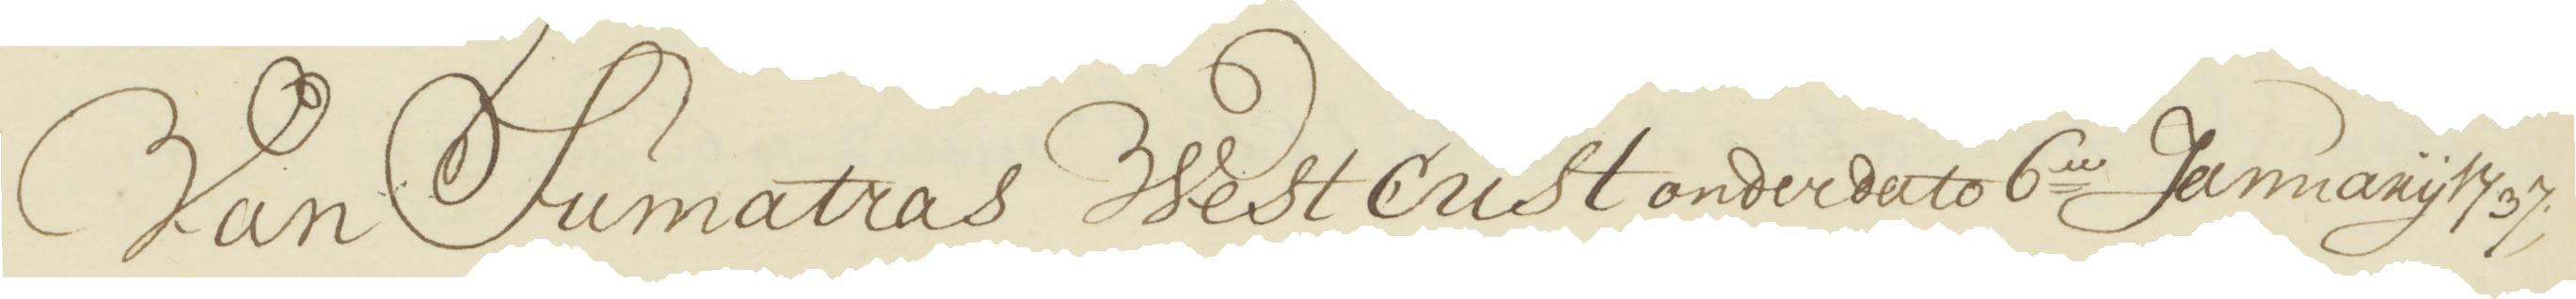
Van Sumatras West cust onder dato 6=n Januarij 1737;
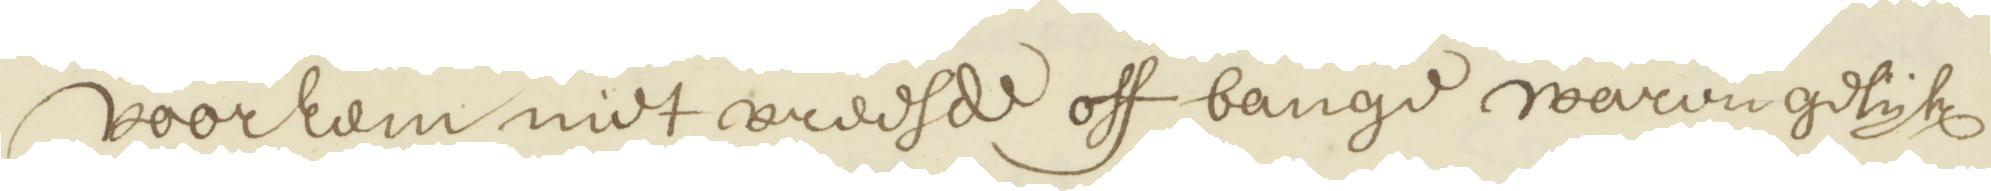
voor hem niet vreesde off bange waren gelijk
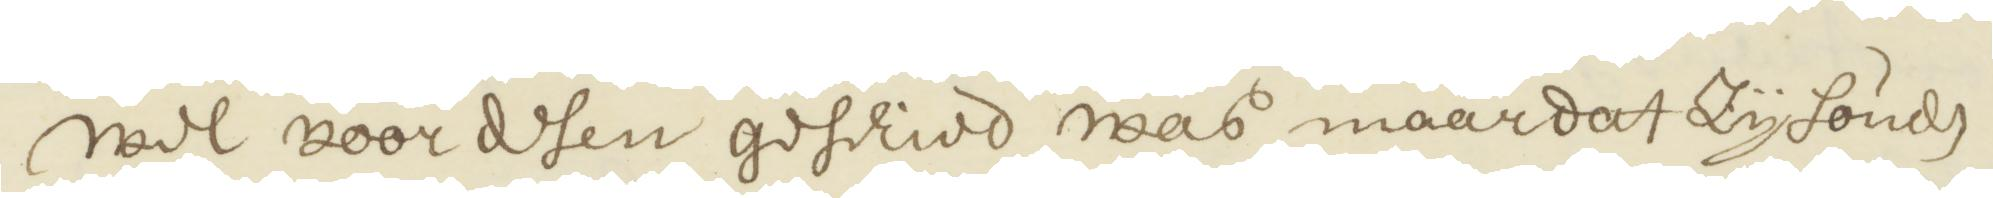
wel voor desen geschied was maar dat Zij souden
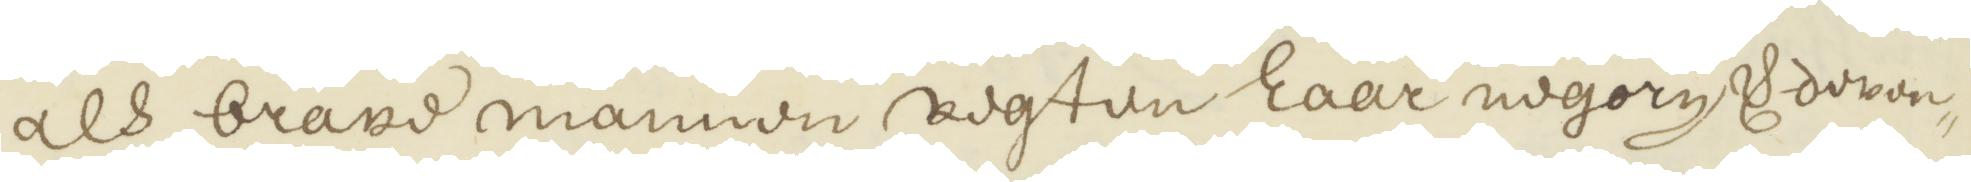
als brave mannen vegten haar negorij verdeven„
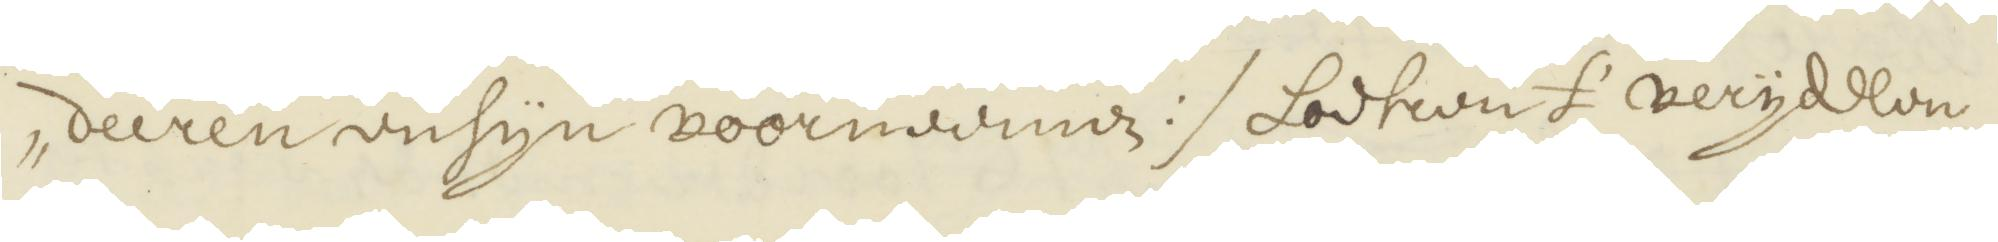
„deeren en sijn voorneemen :/ soeken t' verijdelen
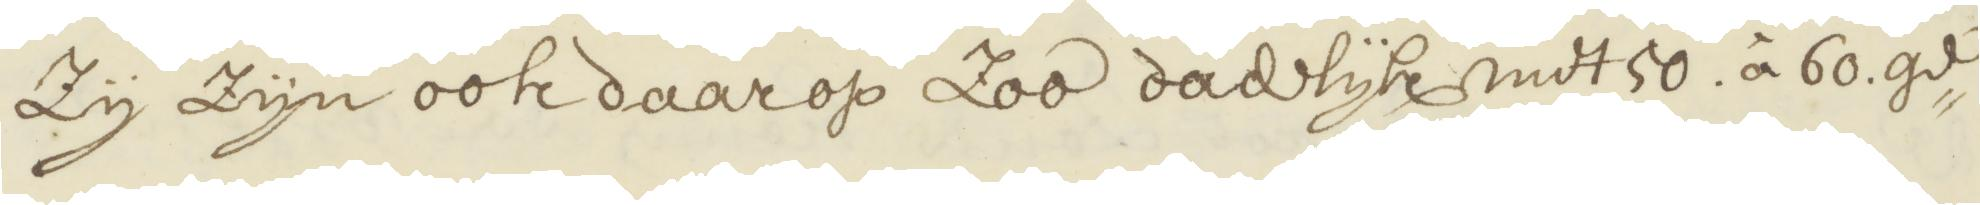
Zij Zijn ook daar op Zoo dadelijk met 50. â 60. ge„
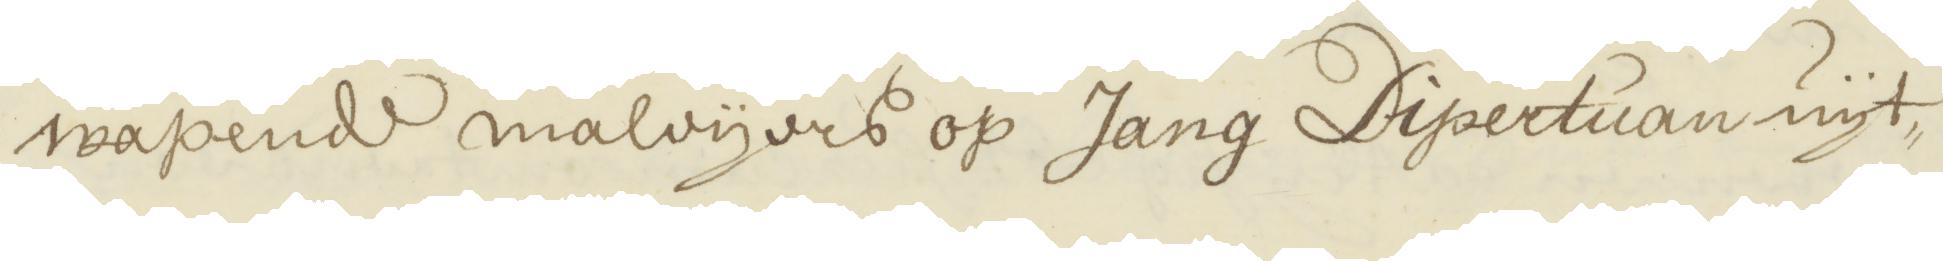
wapende maleijers op Jang Dipertuan uijt„
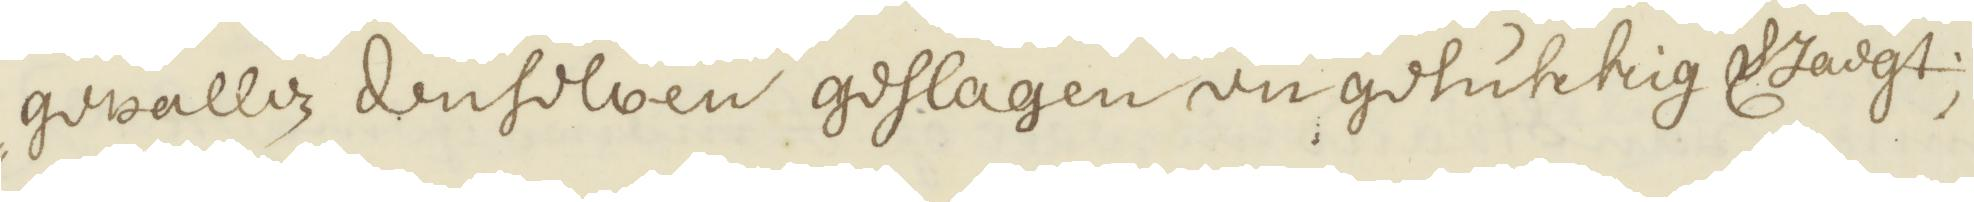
„gevallen denselven geslagen en gelukkig verjaegt;
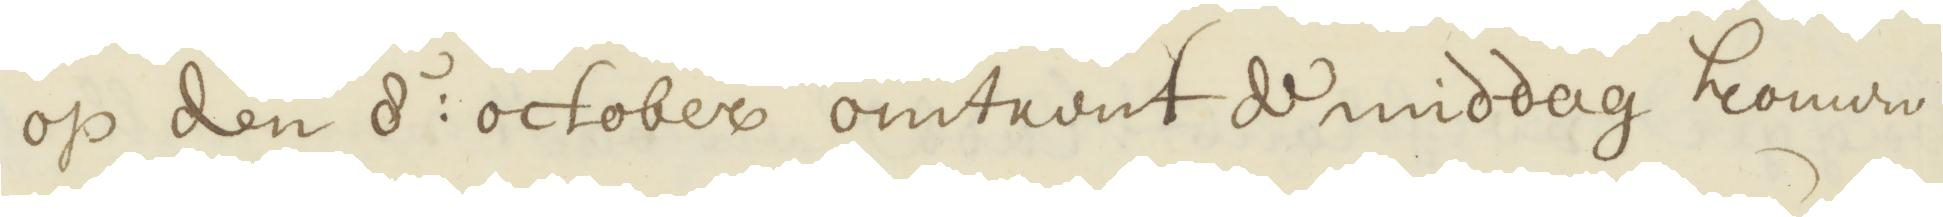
op den 8:' october omtrent de middag komen
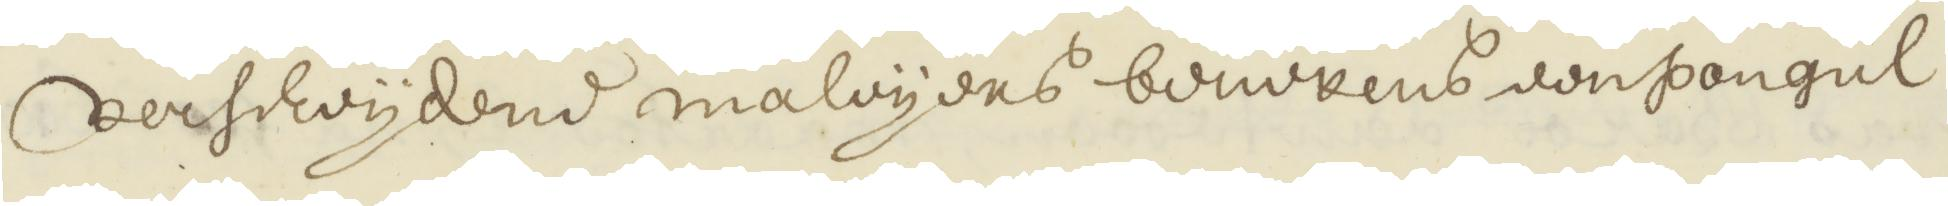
verscheijdene maleijers benevens een pongul
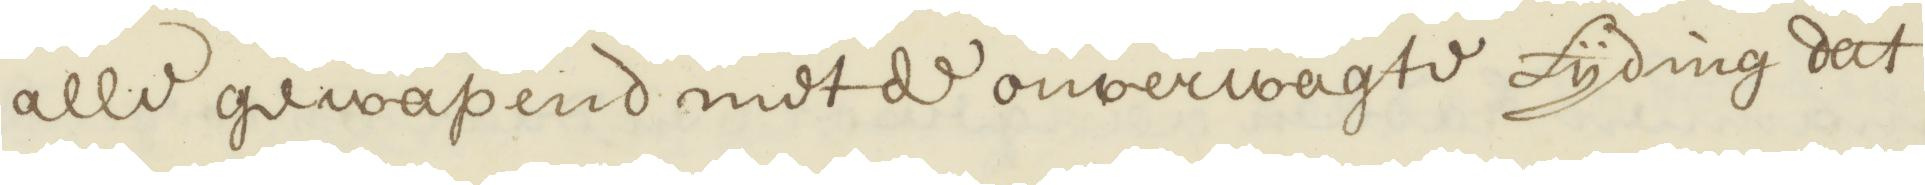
alle gewapend met de onverwagte tijding dat
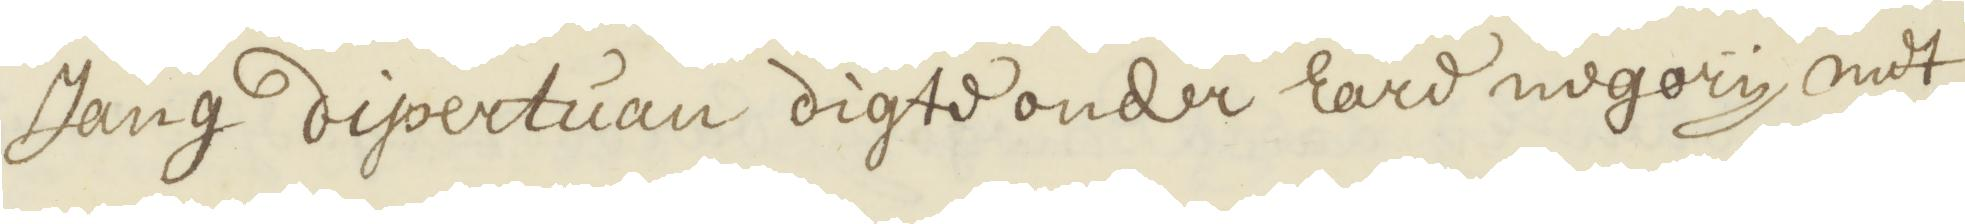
Jang dipertuan digte onder hare negorij met
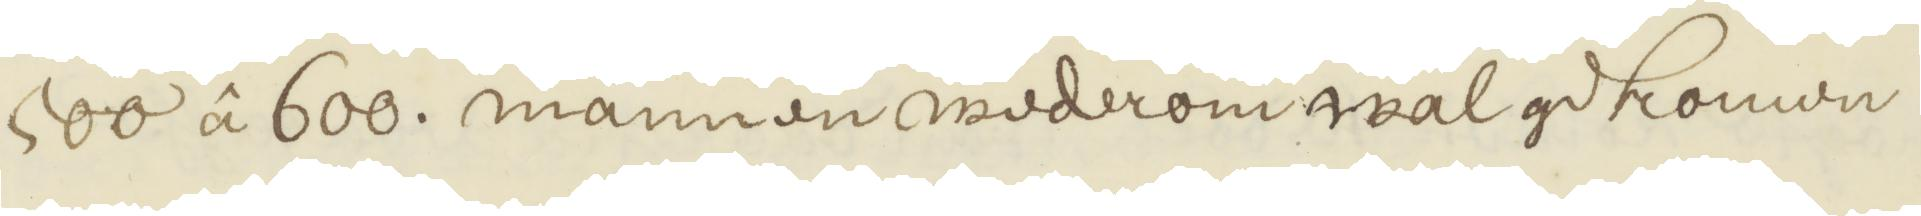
500 â 600. mannen wederom wal gekomen
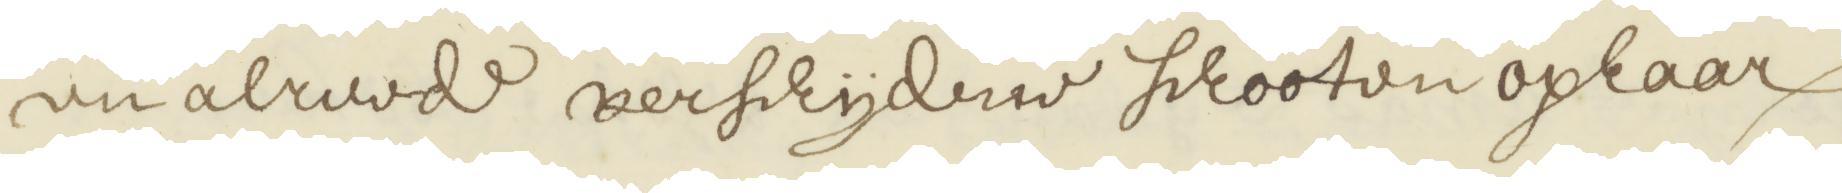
en alreede verschijdene schooten ophaar
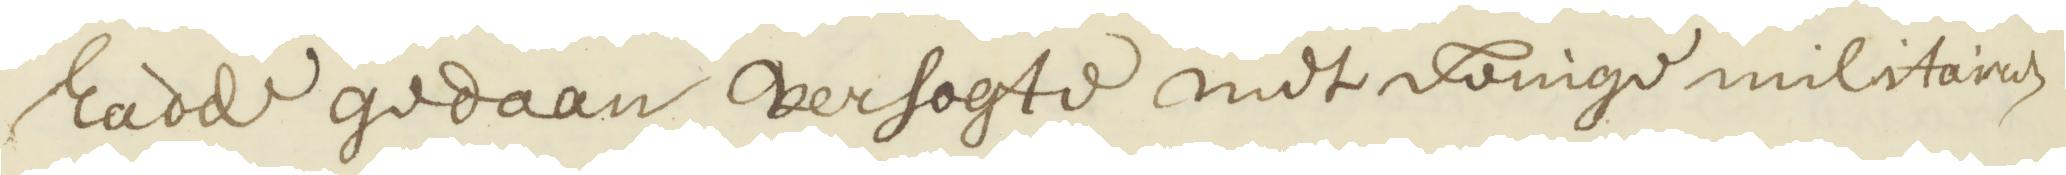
hadde gedaan versogte met Eenige militairen
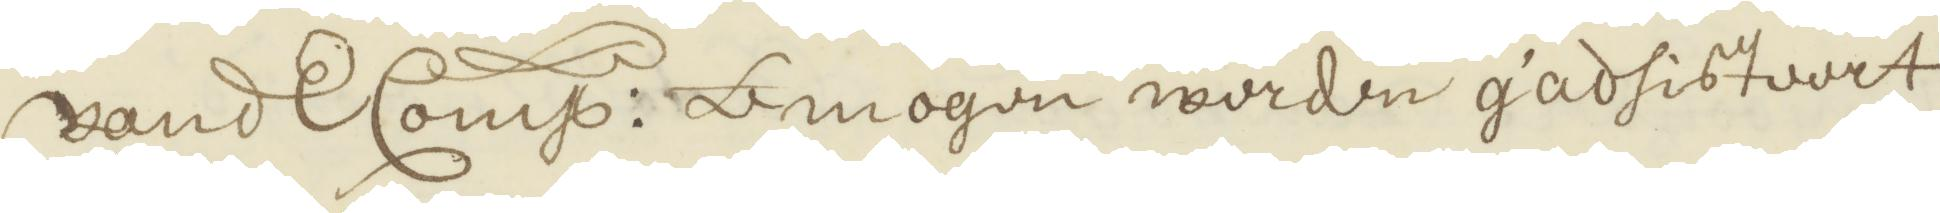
van d E Comp: te mogen werden g’adsisteert
